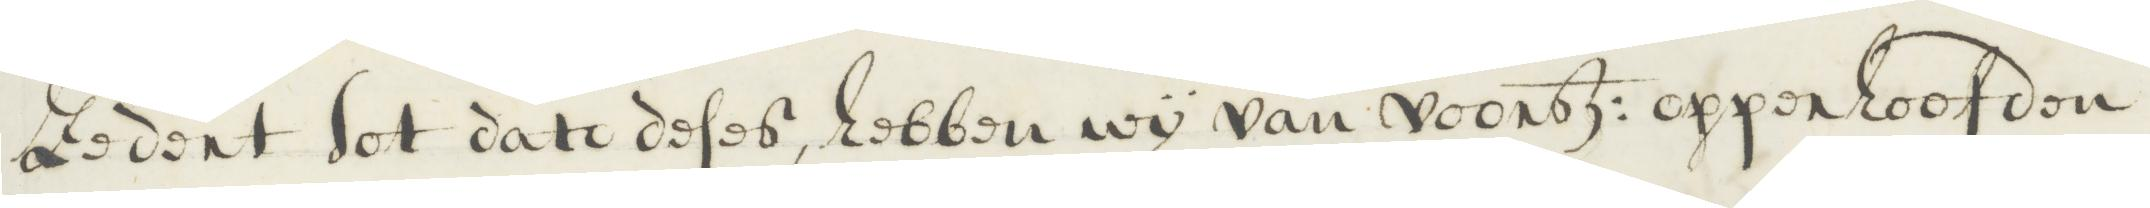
zedert tot dato deses, hebben wij van voorsz: opperhoofden
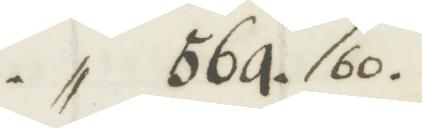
„ 564 23/60.
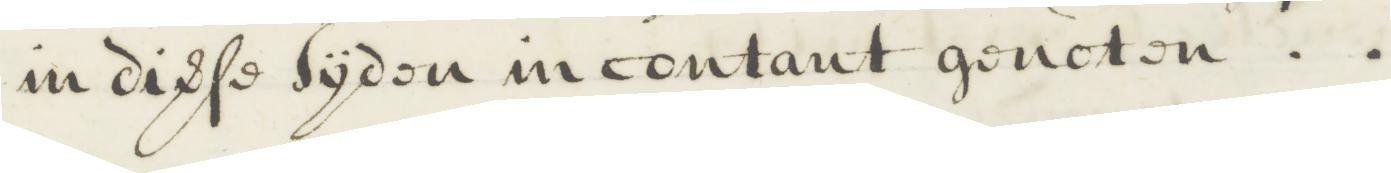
in diverse tijden in contant genoten . .
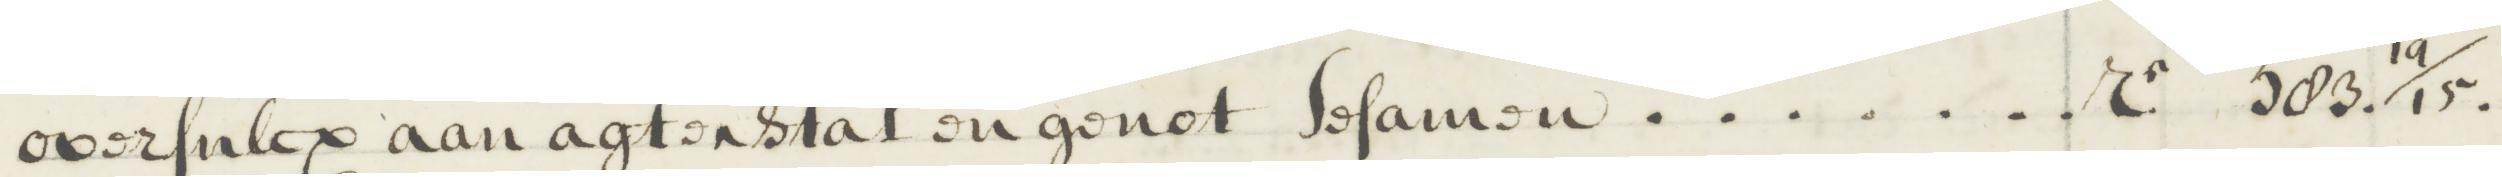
oversulcx aan agterstal en genot tesamen . . . . . . . r. 583. 19/15.
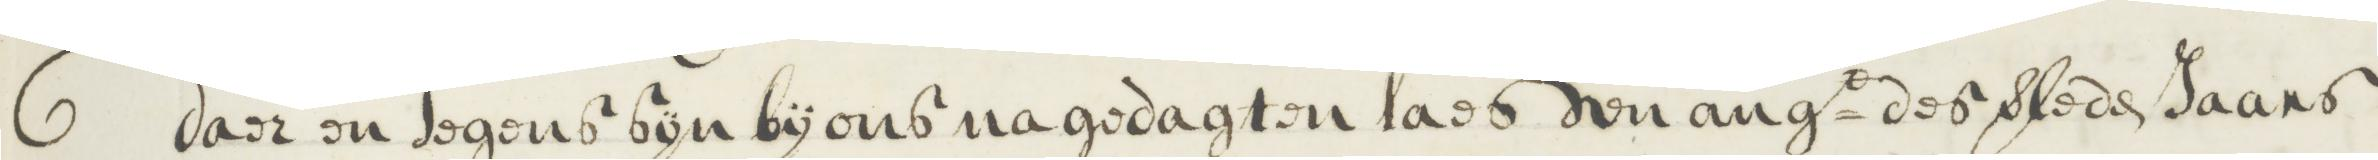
daer en tegens sijn bij ons na gedagten laesten aug=o des verleden Iaars
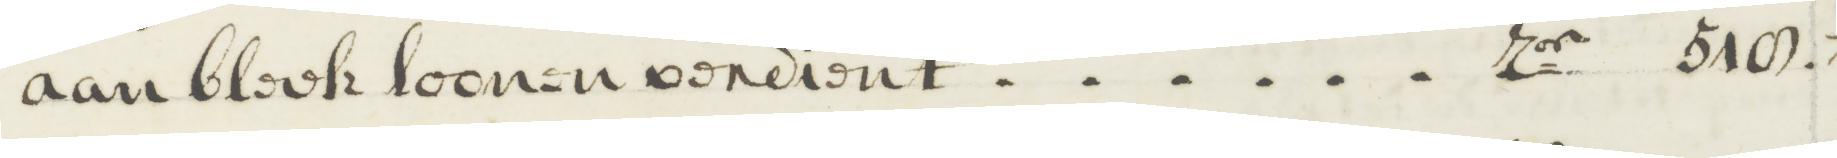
aan bleek loonen verdient . . . . . . r=os 518.:
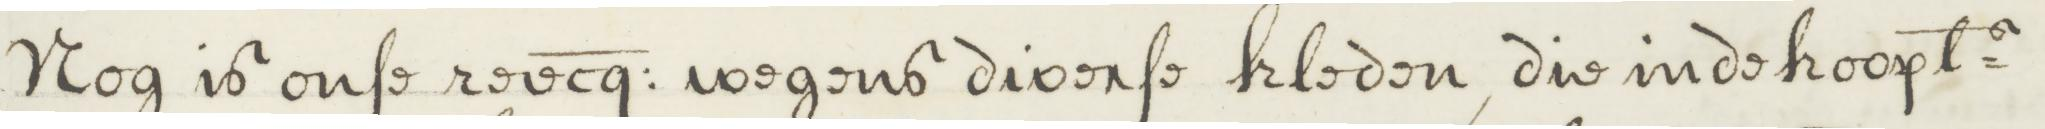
Nog is onse reecq: wegens diverse kleden, die in de koopl=s
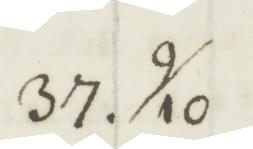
37. 9/10
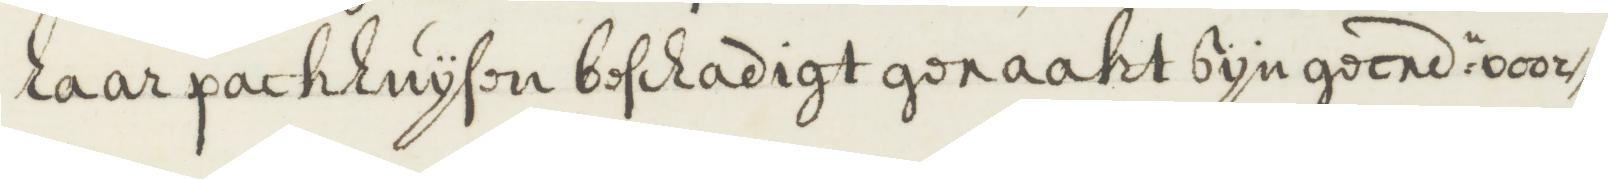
haar packhuijsen beschadigt geraakt sijn geord=n voor„
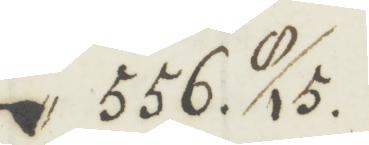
„ 556. 8/15.
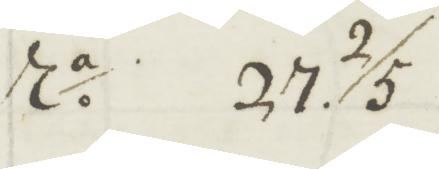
r a/o 27. 2/5
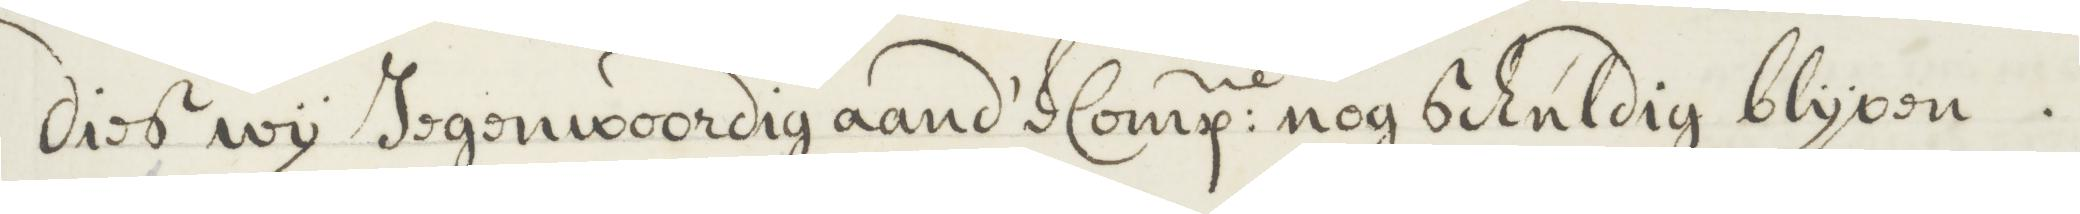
dies wij Iegenwoordig aan d’EComp:e nog schuldig blijven .
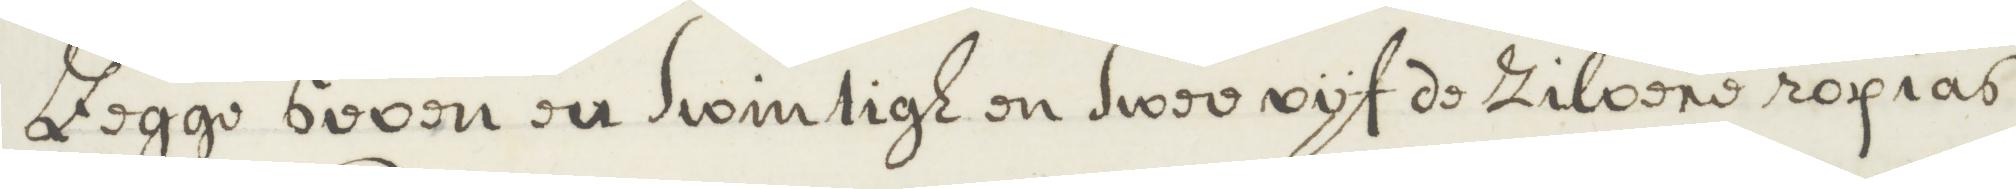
Zegge seven en twintigh en twee vijfde zilvere ropias
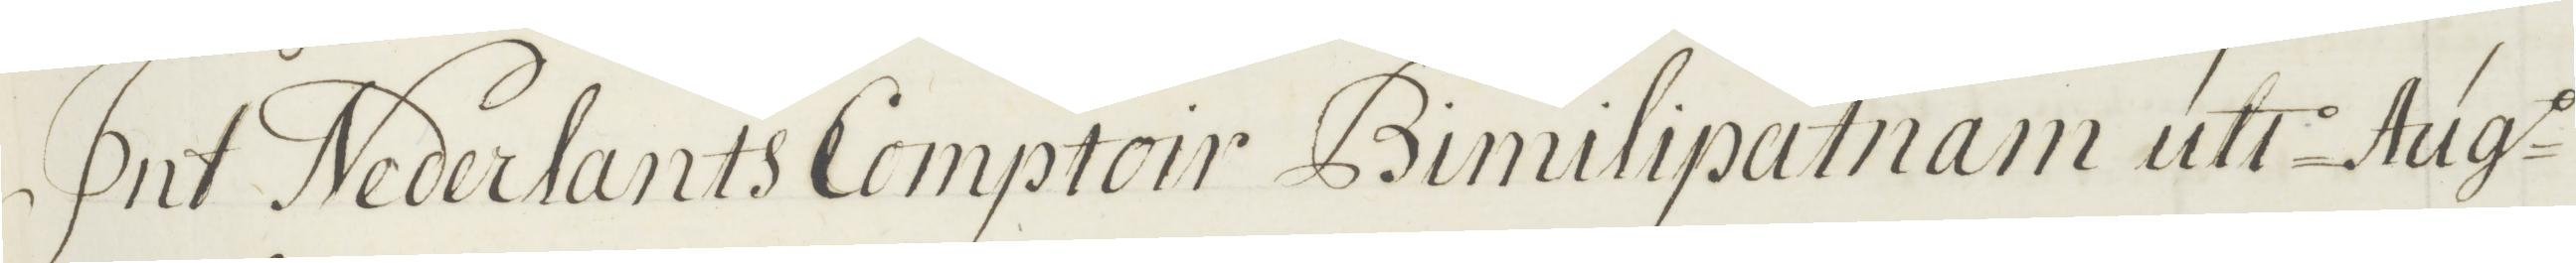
Jnt Nederlants Comptoir Bimilipatnam ult=o Aug=o
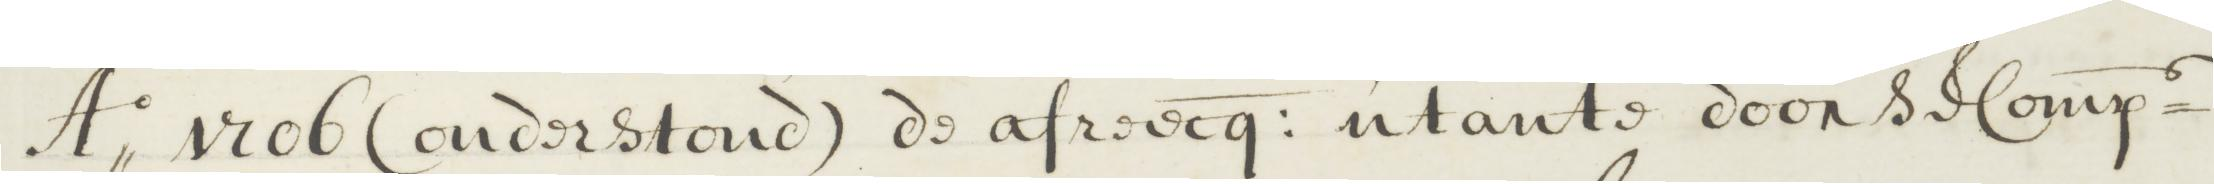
A„o 1706 (onderstond) de afreecq: utante door s EComp=s
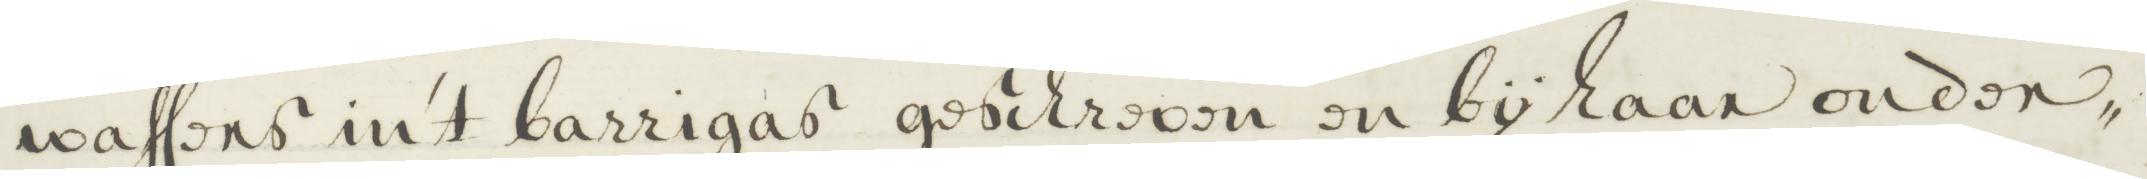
wassers in ’t barrigas geschreven en bij haar onder„
